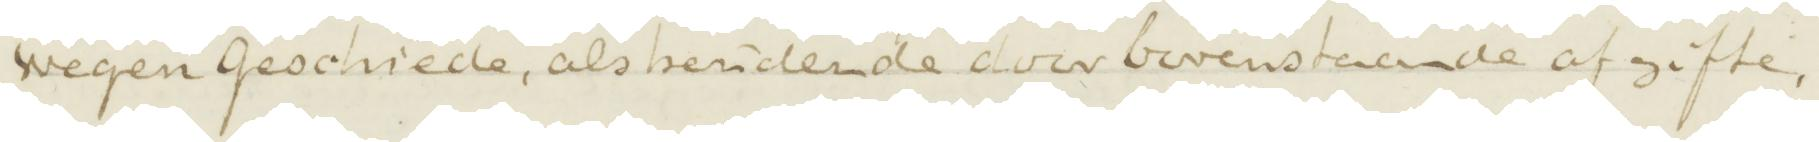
wegen geschiede, als houdende door bovenstaande afgifte,
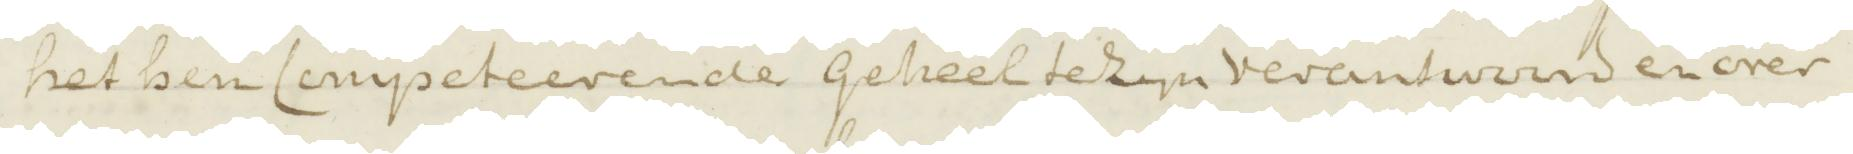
het hen Competeerende geheel te zyn verantwoord en over
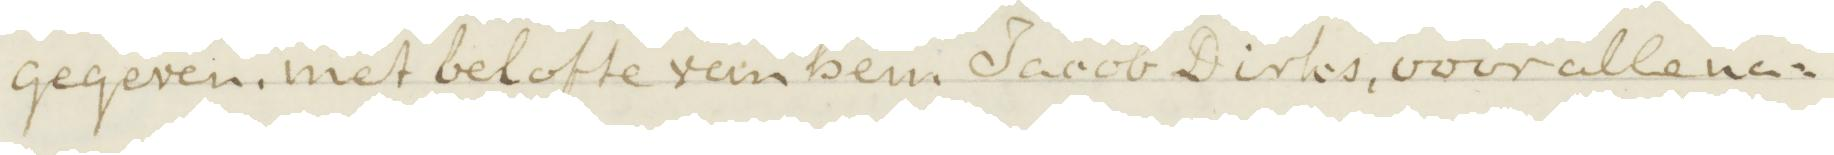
gegeven. met belofte van hem Jacob Dirks, voor alle na=
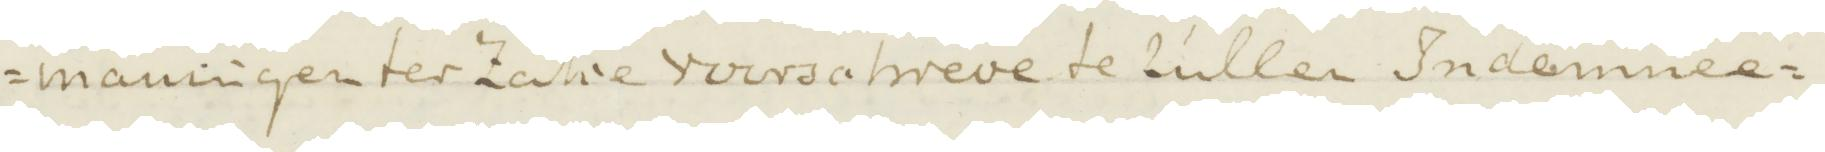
=maningen ter zake voorschreve te zullen Jndemnee=
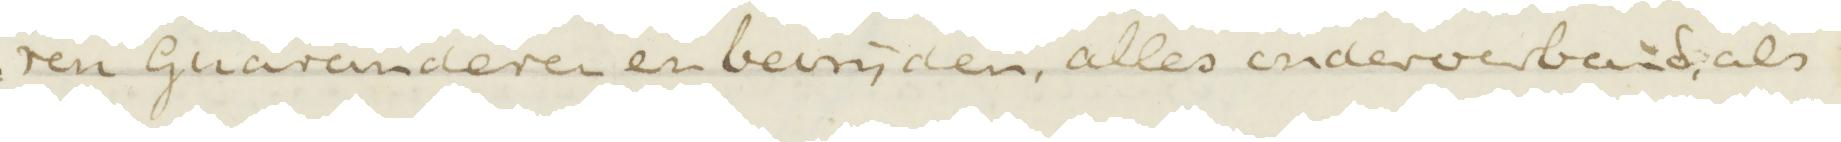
=ren Guaranderen en bevrijden, alles onderverband, als
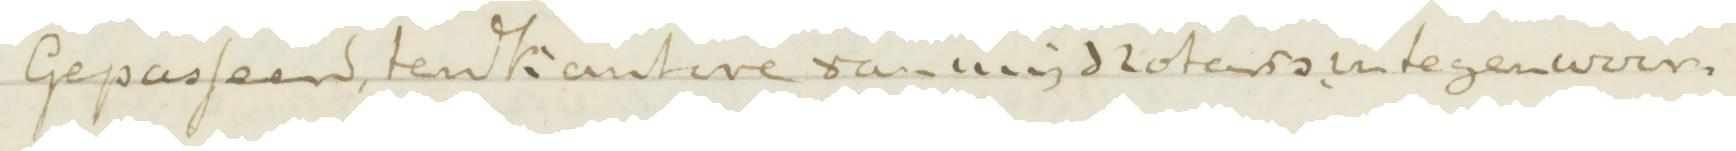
Gepasseerd, ten Kantore van mij Notaris in tegenwoor-
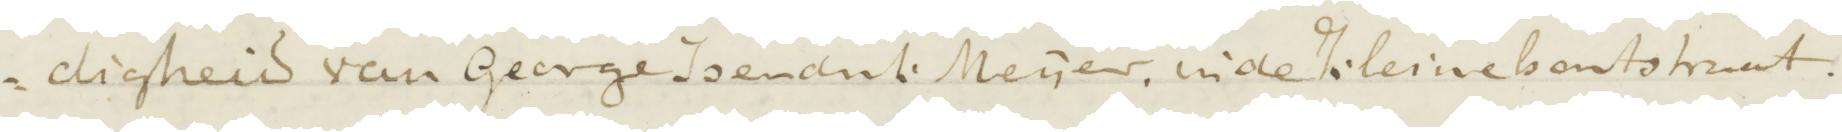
=digheid van George Hendrik Meijer, in de Kleinehoutstraat
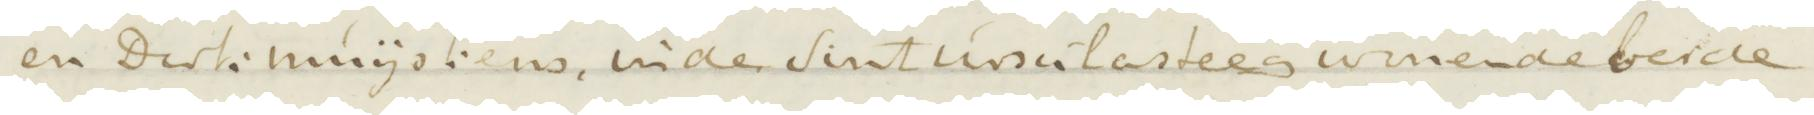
en Dirk muijskens, in de Sint Ursulasteeg wonende beide
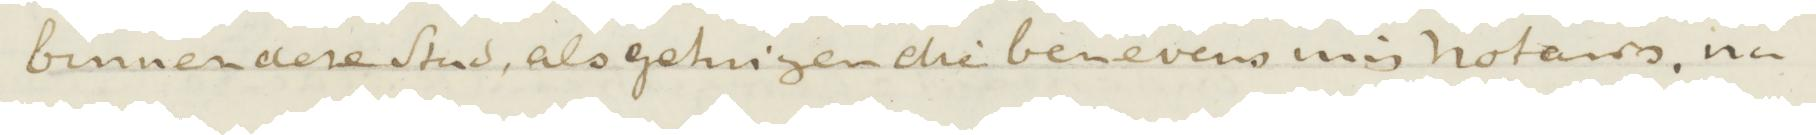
binnen deze Stad, als getuigen die benevens mij notaris, na
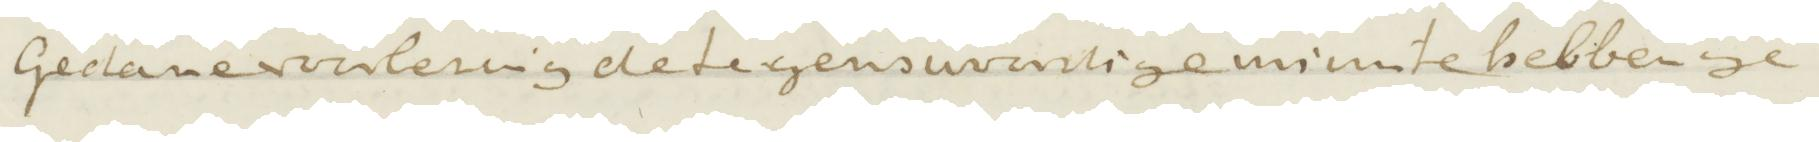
Gedane voorlezing de tegenswoordige minute hebben ge
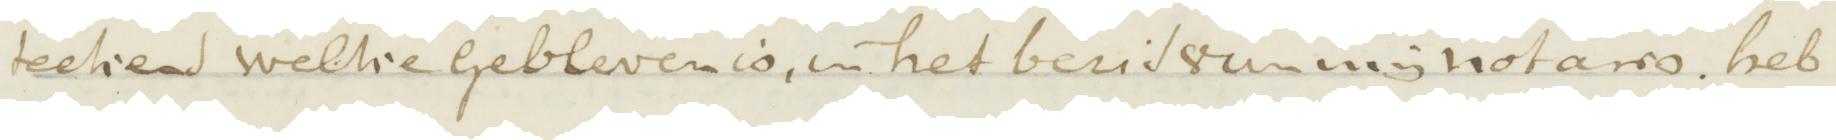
teekend welke Gebleven is, in het bezit van mij notaris, heb
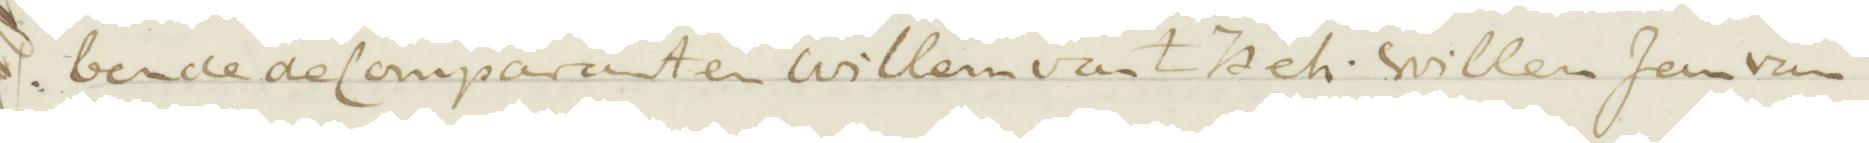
=bende de Comparanten willem van t Hek. willem Jan van
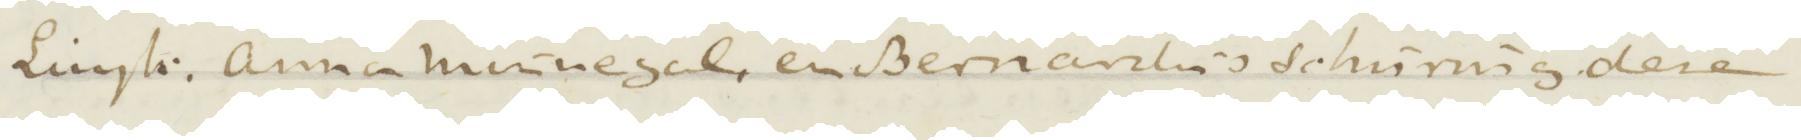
Luyk. Anna minnegal, en Bernardus schuring, deze
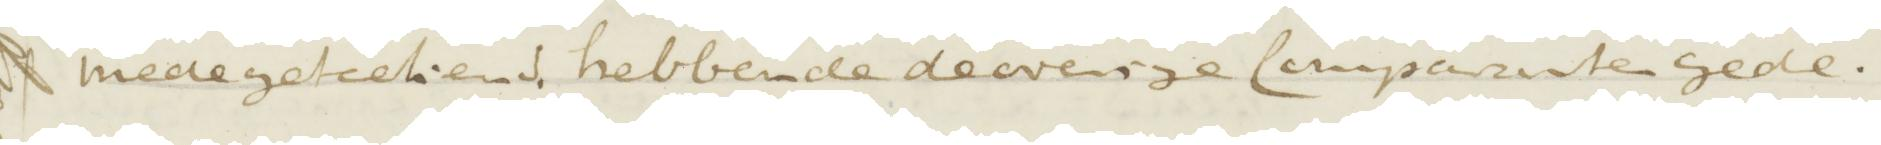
medegeteekend. hebbende de overige Comparanten gede.
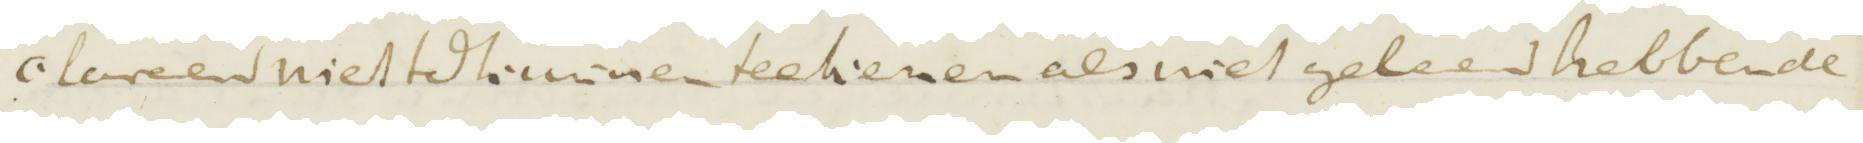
clareerd niet te kunnen teekenen als niet geleerd hebbende
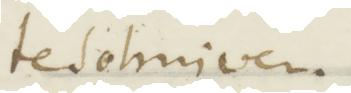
te schrijven.
